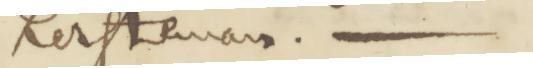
kersteman. —
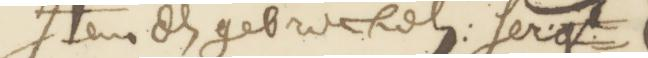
Item den gebreckelijke serg=t
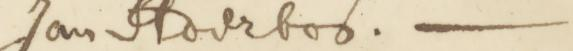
Jan Elderbos. —
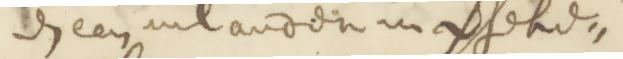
en een inlander in verseke„
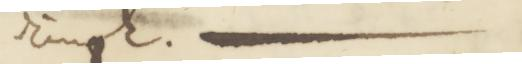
ringh. —
